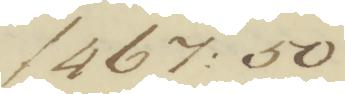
ƒ467: 50
